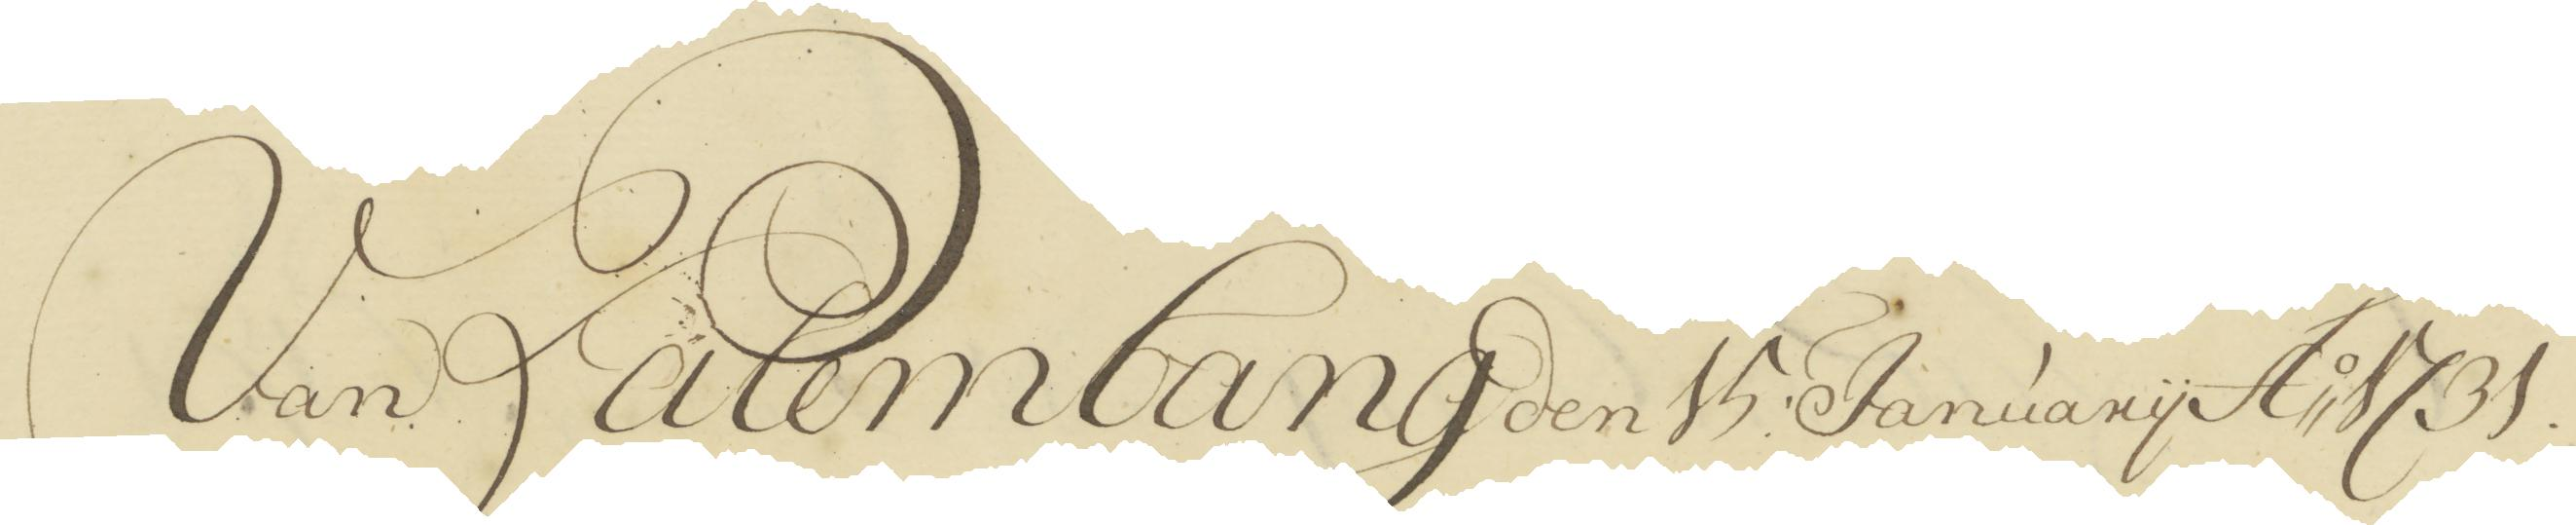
Van Palembang den 15:' Ianuarij A„o 1731.
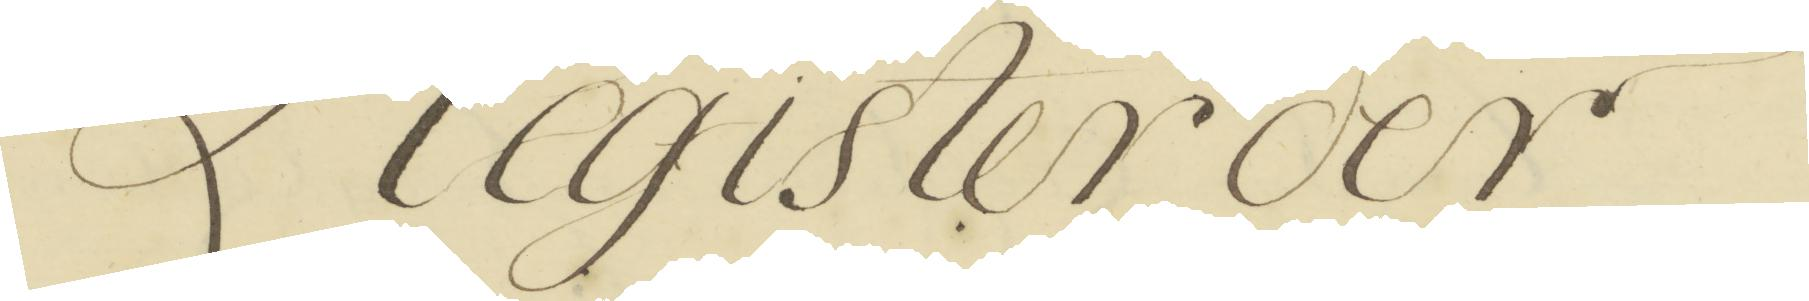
Register der
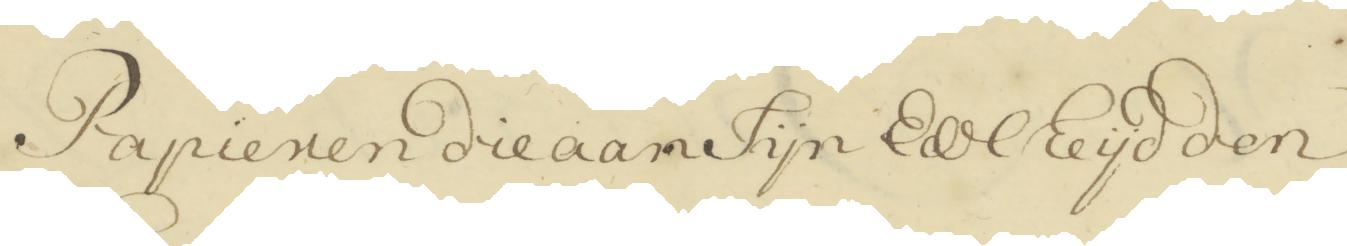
Papieren die aan sijn Edelheijd den
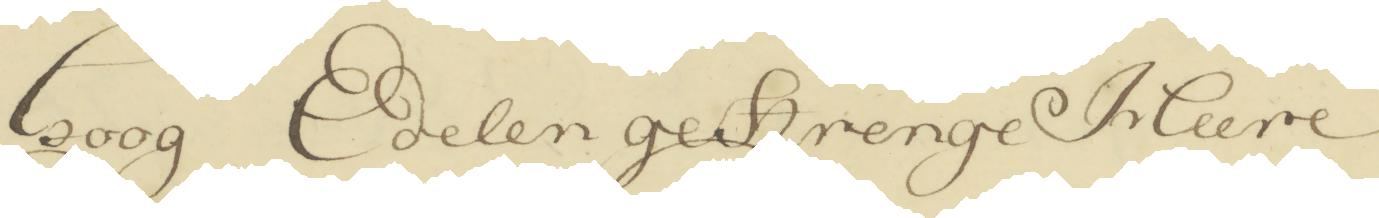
hoog Edelen gestrenge Heere
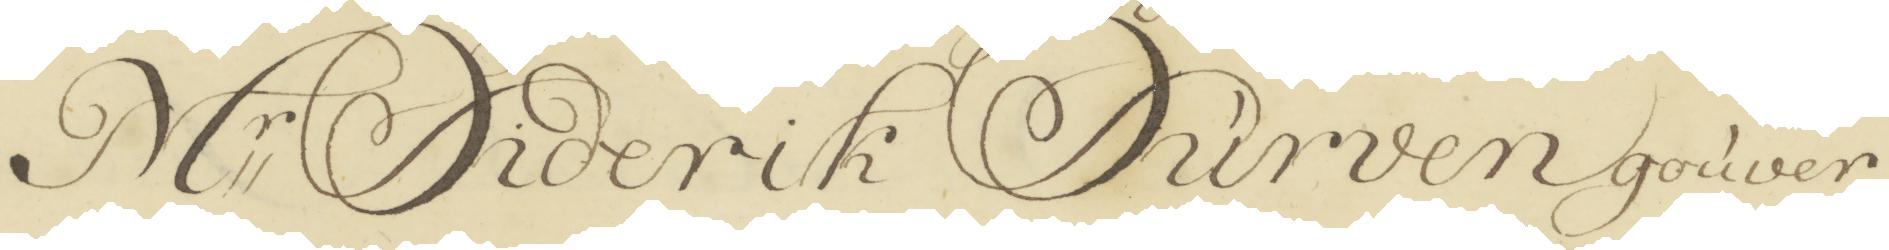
M„r Diderik Durven gouver
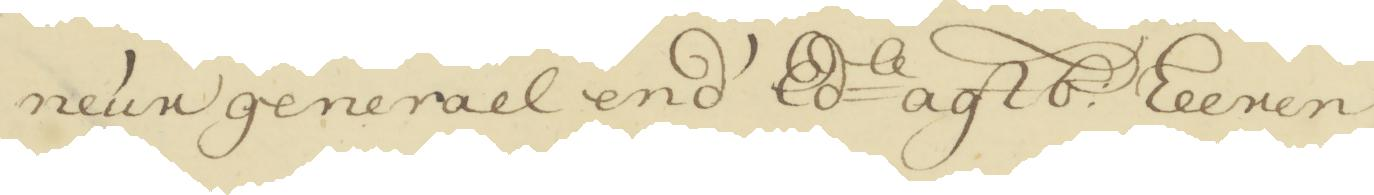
neur generael en d’Ed=le agtb: heeren
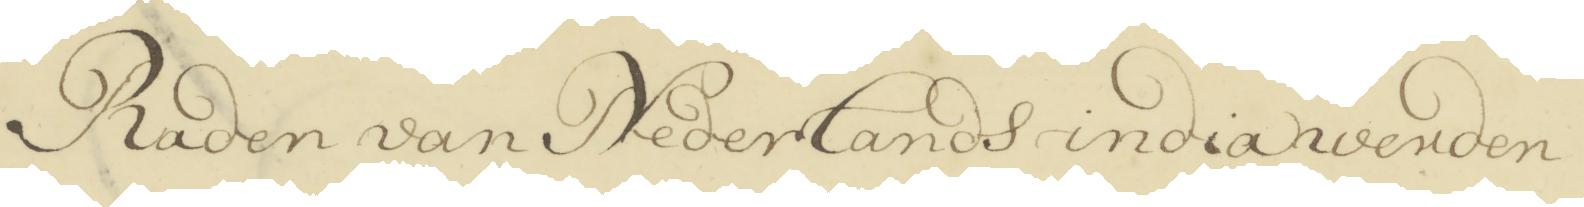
Raden van Nederlands india werden
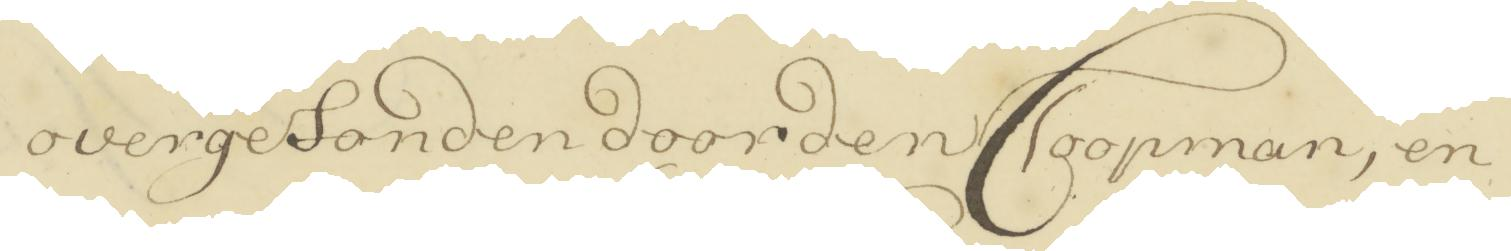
overgesonden door den Coopman, en
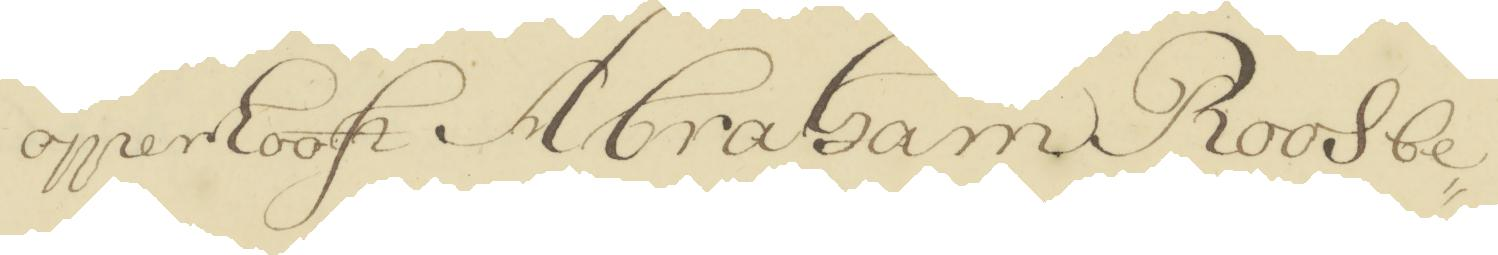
opperhooft Abrabam Roos be„
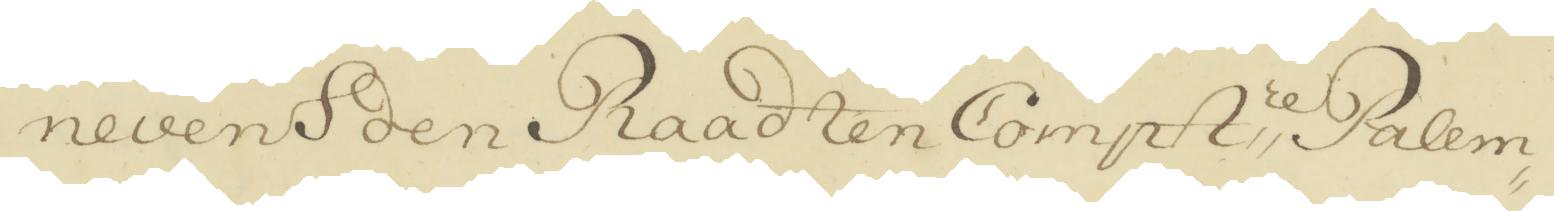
nevens den Raad ten Compt„re Palem„
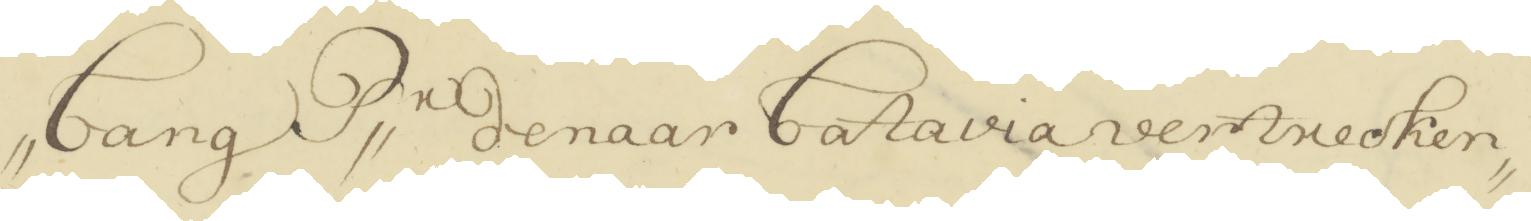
„bang P„r denaar batavia verstrecken„
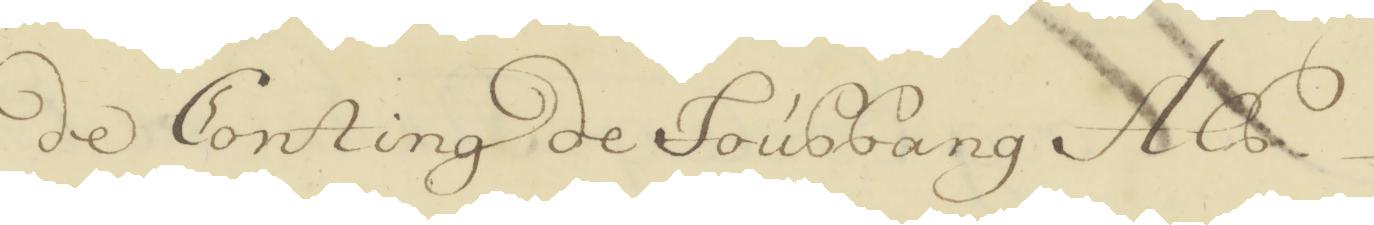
de Conting de Soussang Als
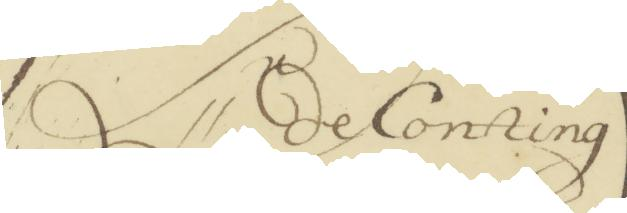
P„r de Conting
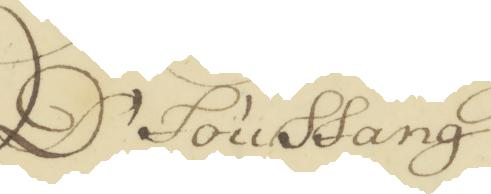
D' Soussang
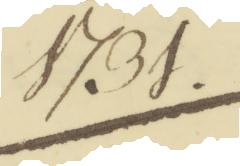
1731.
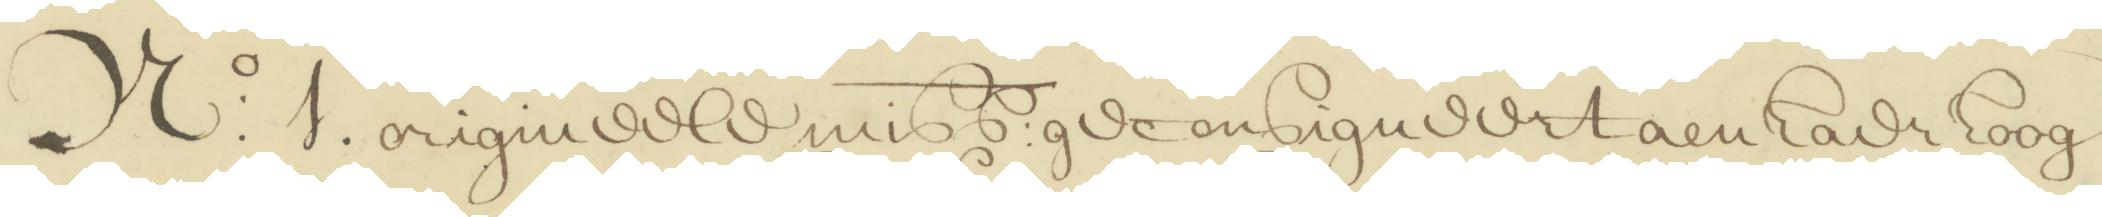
N:o 1. origineele miss:s geconsigneert aen haer hoog
